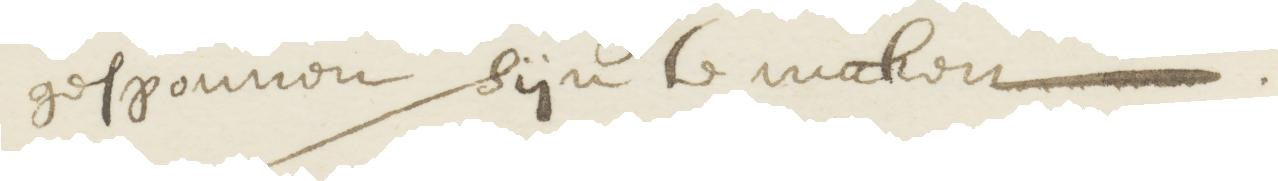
gesponnen sijn te maken
